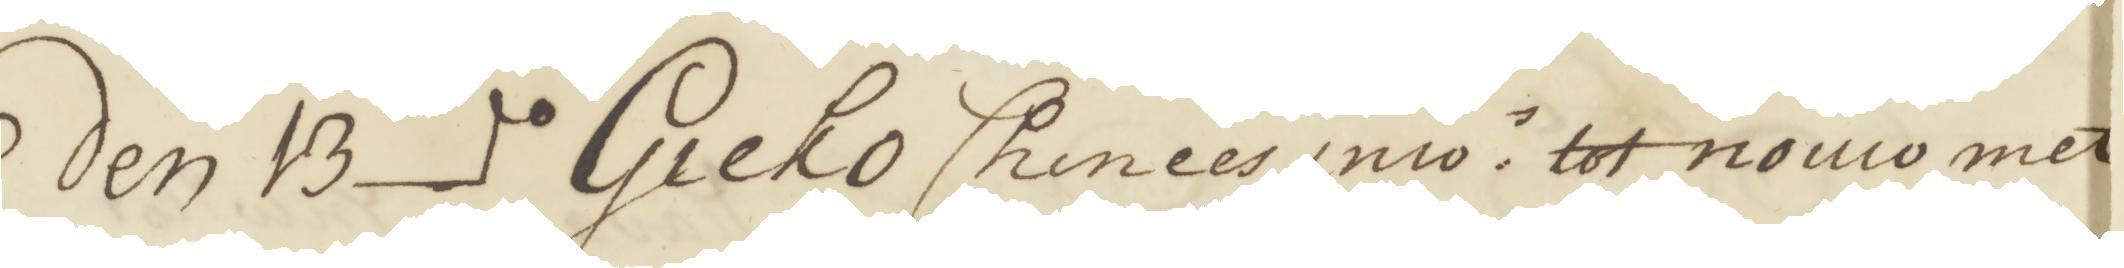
den 13 _o Gieko Chinees jnw:s tot riouw met
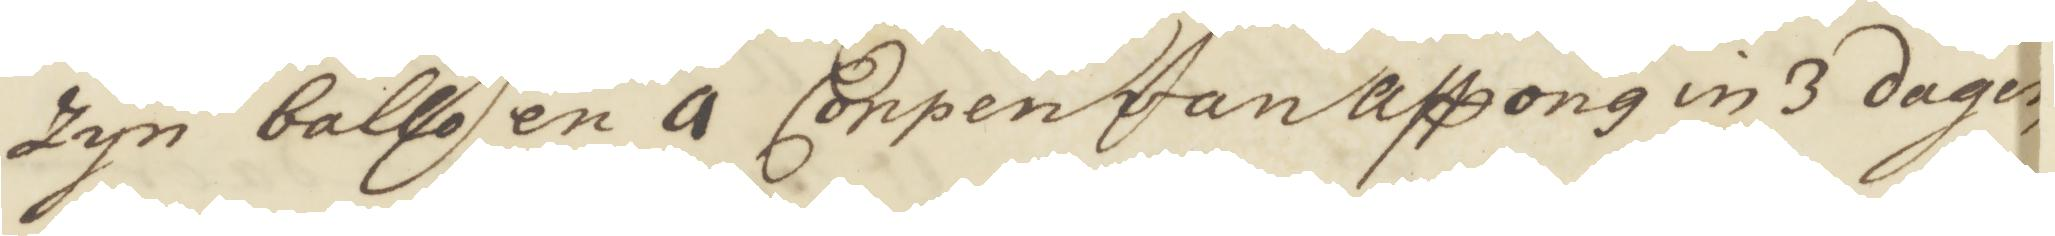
zyn ballo en 4 Coppen van appong in 3 dagen
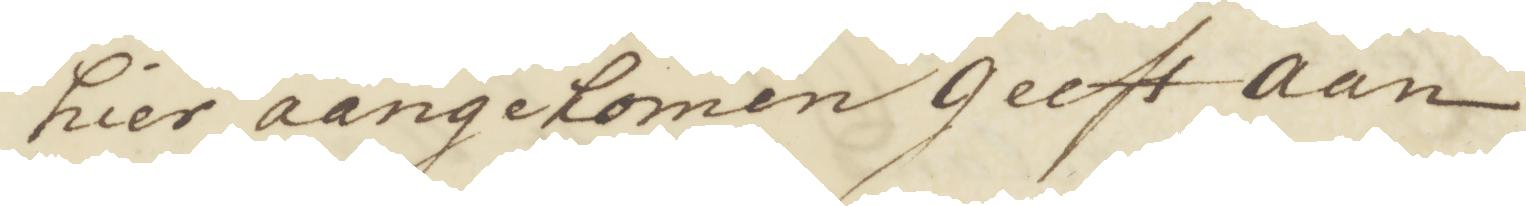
hier aangekomen geeft aan
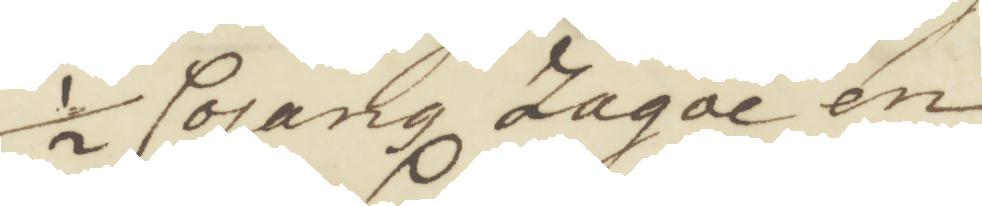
½ Cojang zagoe en
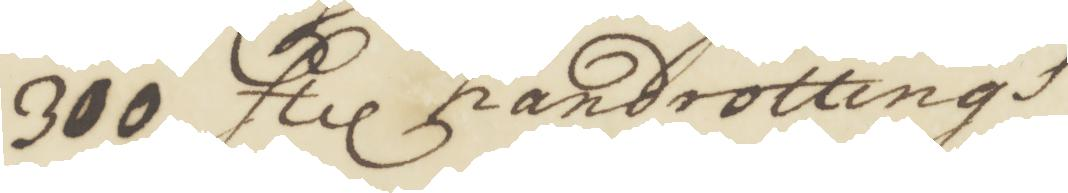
300 stx handrottings
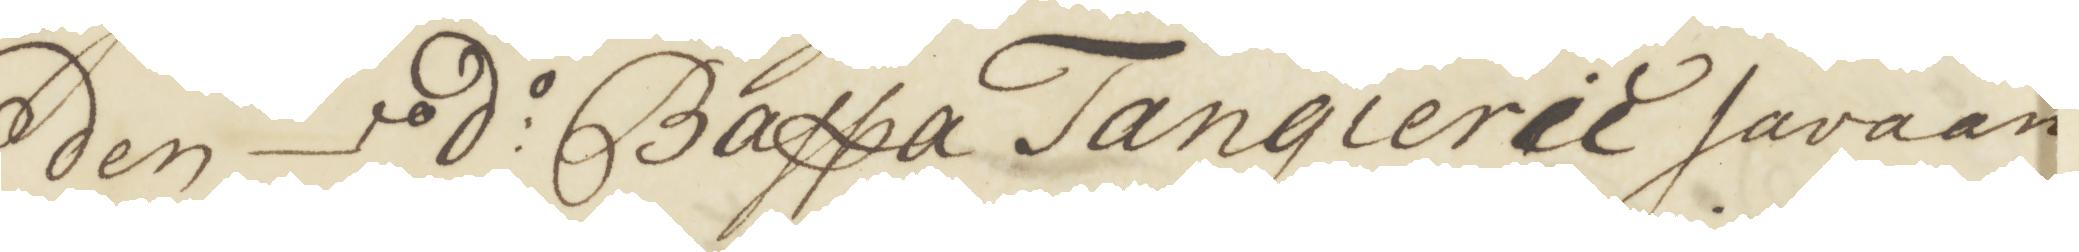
den _o d:o Bappa Tangierie javaan
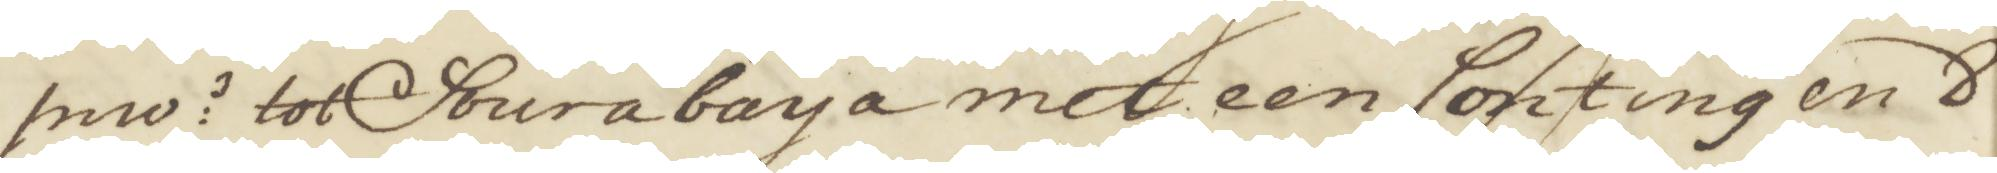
jnw:s tot Sourabaya met een Conting en 8
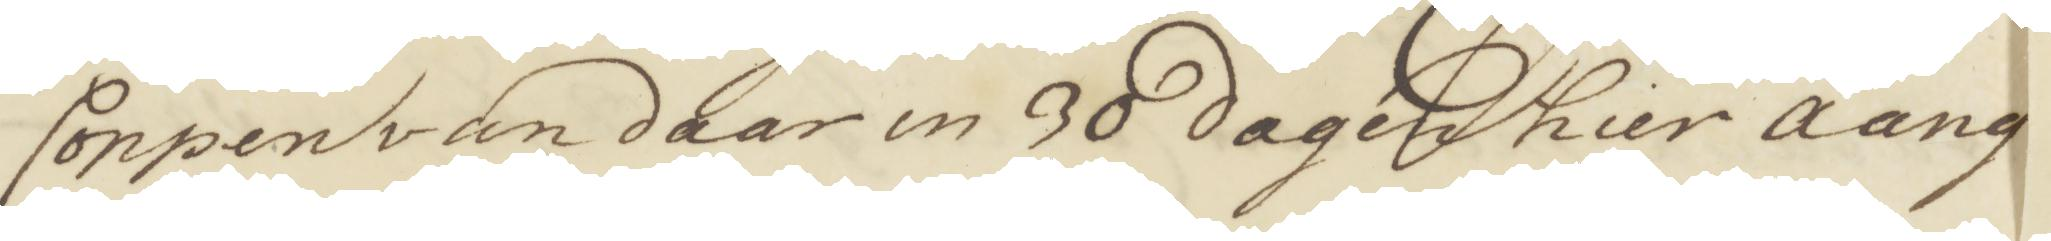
Conpen van daar in 30 dage hier aang
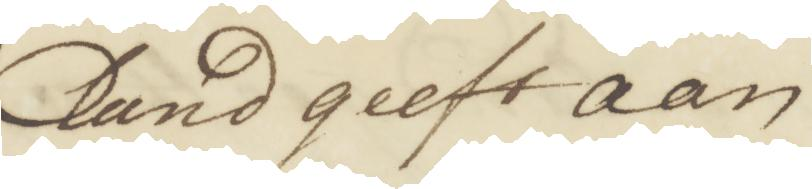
land geeft aan
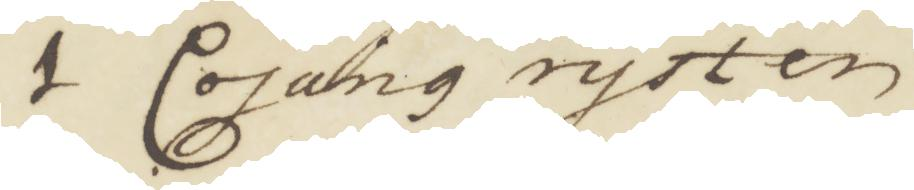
1 Cojang ryst en
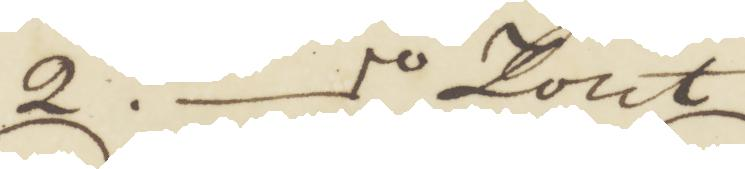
2: _o zout
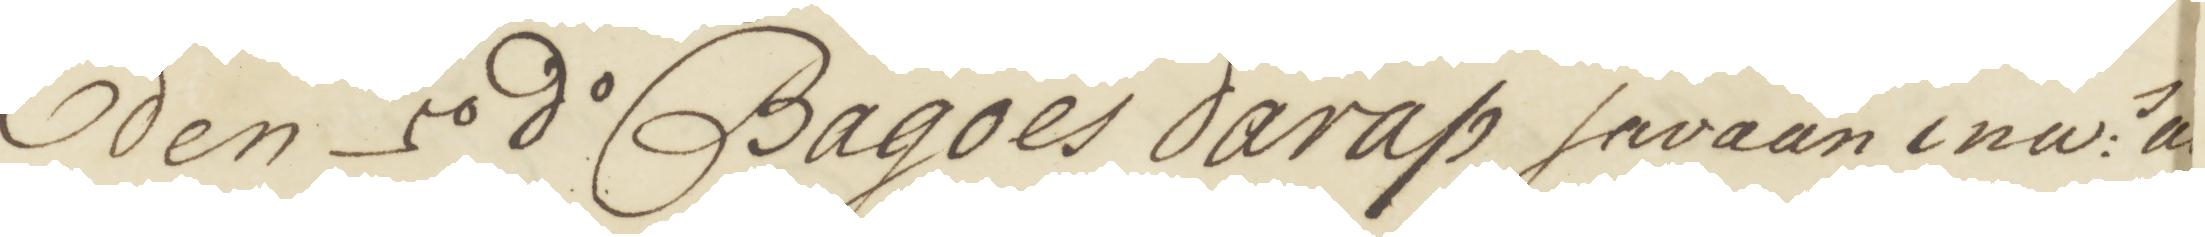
den _o do Bagoes darap javaan inw:s a
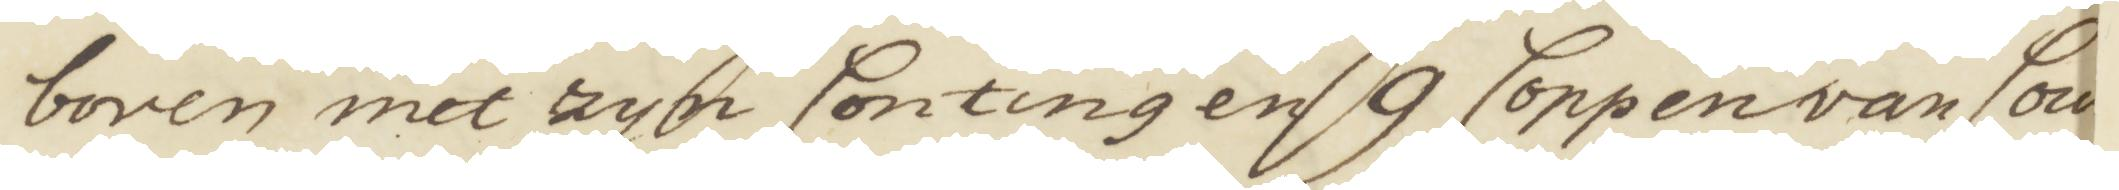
boven met zyn Conting en 9 Coppen van sou
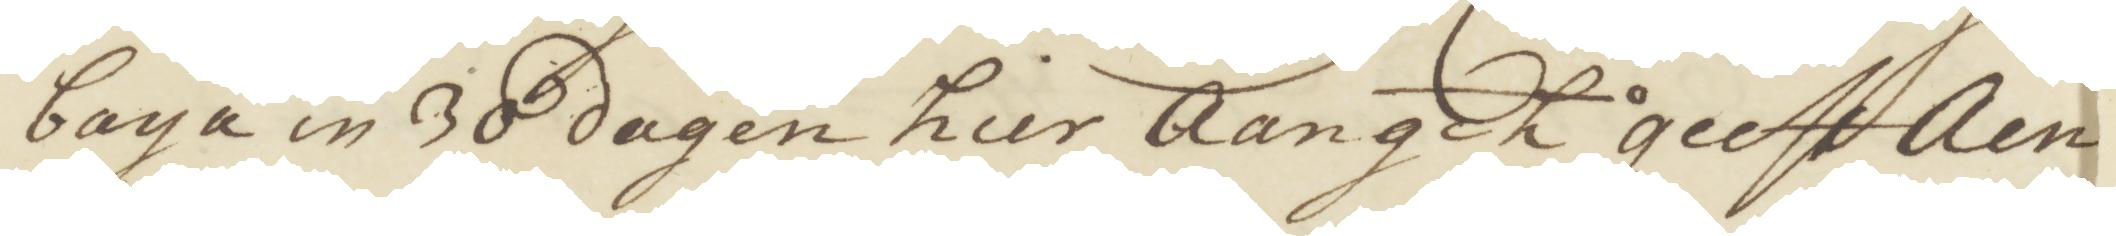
baya in 30 dagen hier aangeko geeft aen
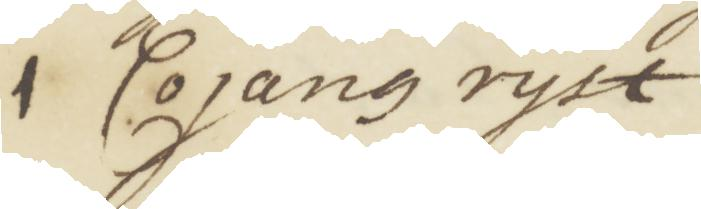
1 Cojang ryst
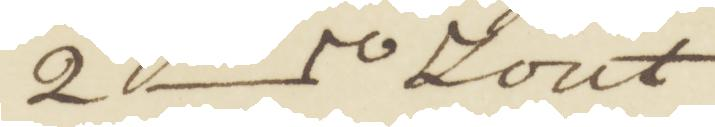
2 _o zout
